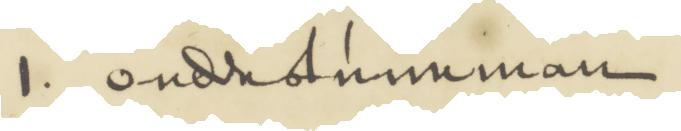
1. onderstuurman
